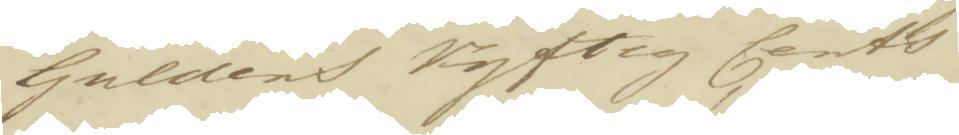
Guldens Vijftig Cents
